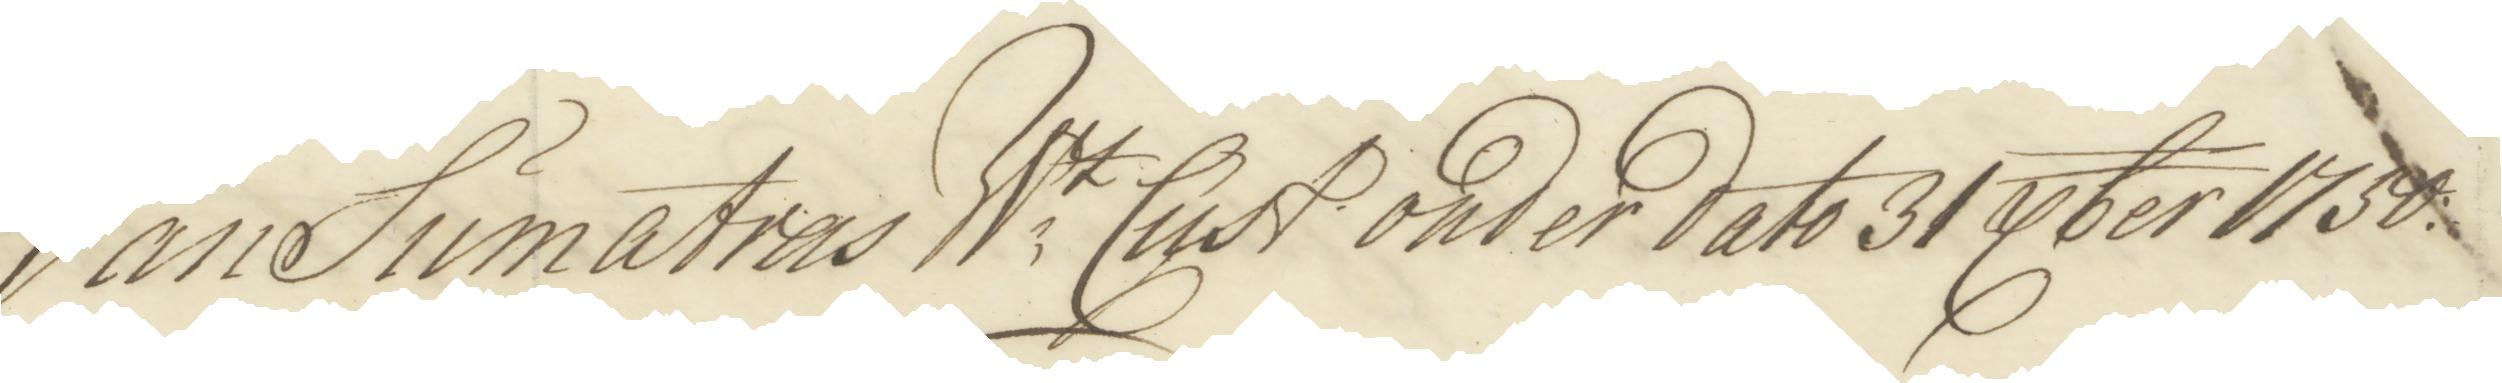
Van Sumatras W„t Cust onder dato 31 xber 1750:
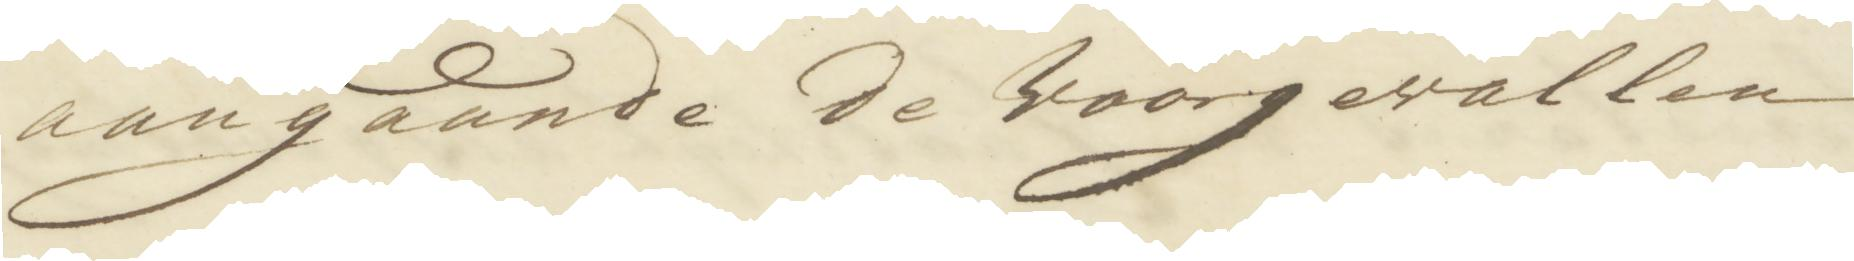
aangaande de voorgevallen
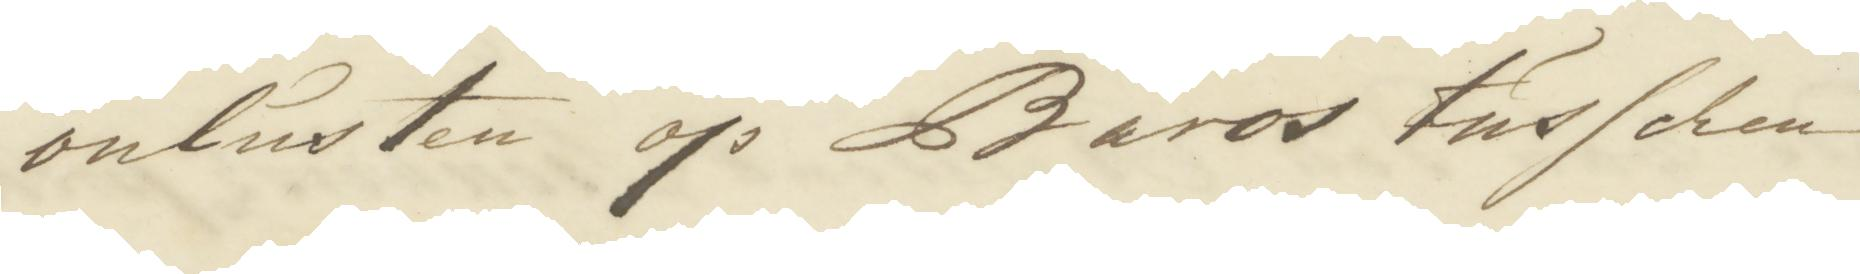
onlusten op Baros tusschen
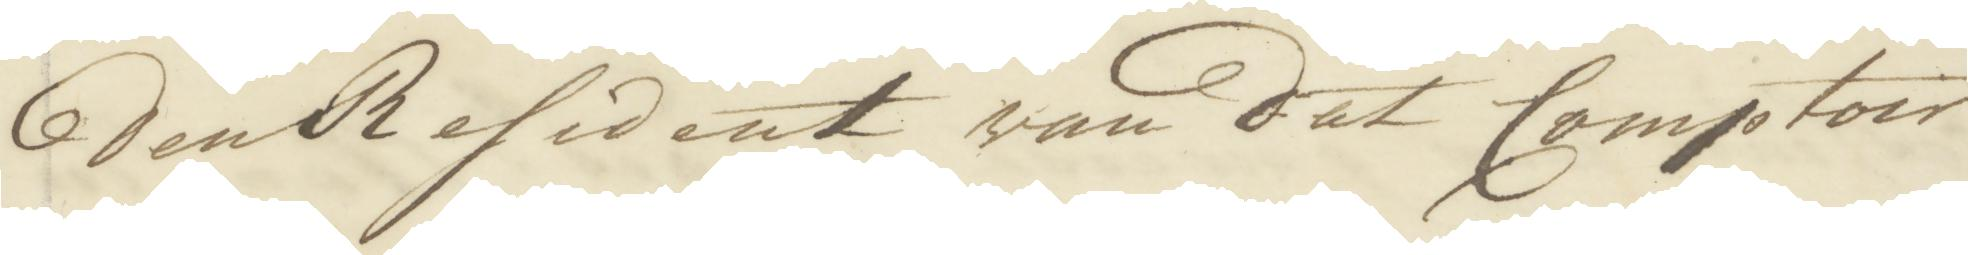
den Resident van dat Comptoir
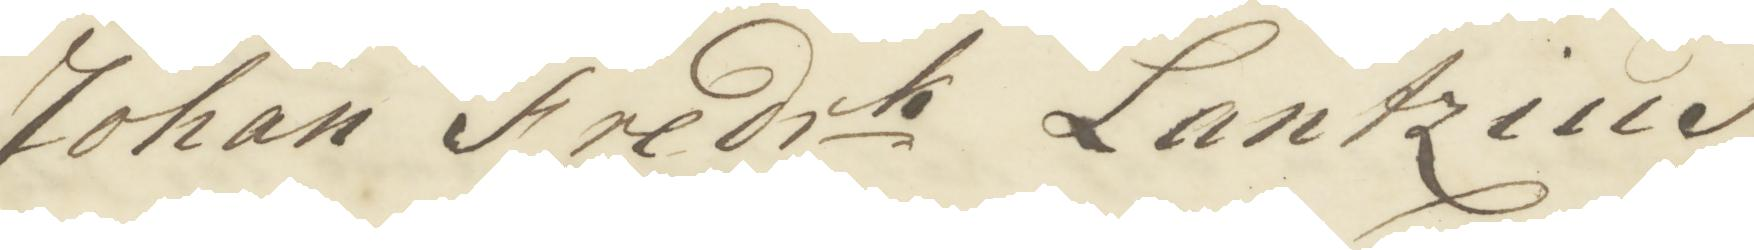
Johan Fredr=k Lantzius
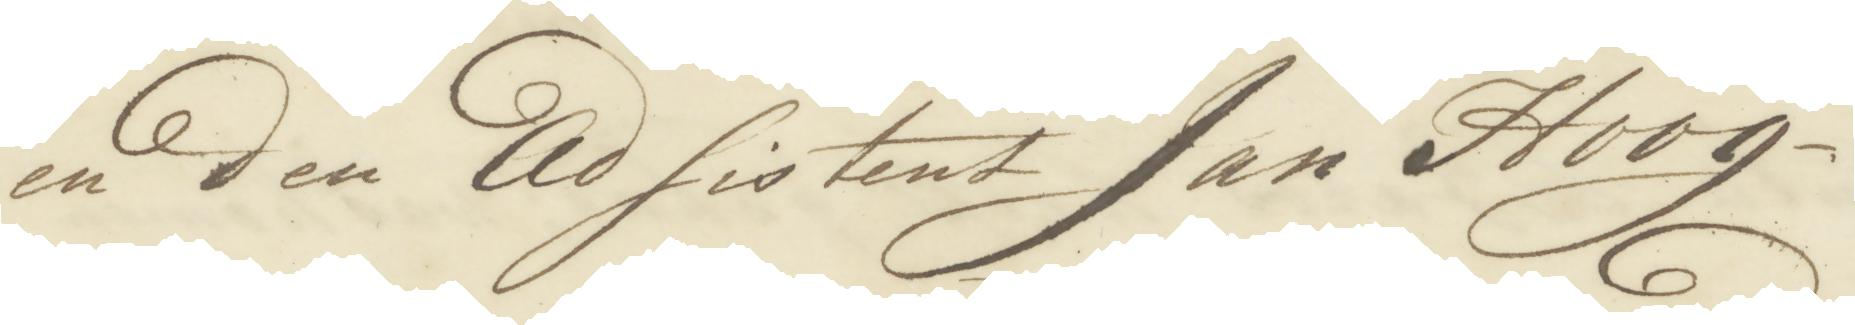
en den Adsistent Jan Hoog-
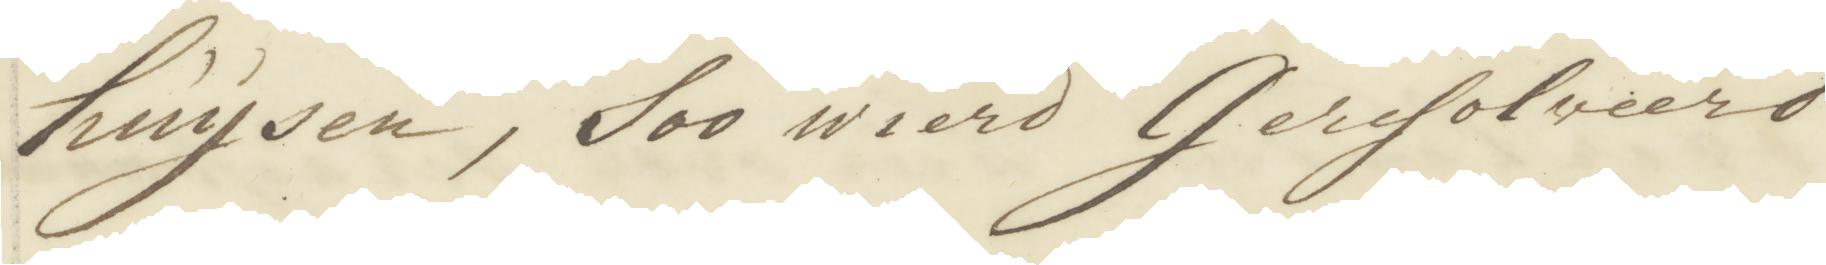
huijsen, soo wierd geresolveerd
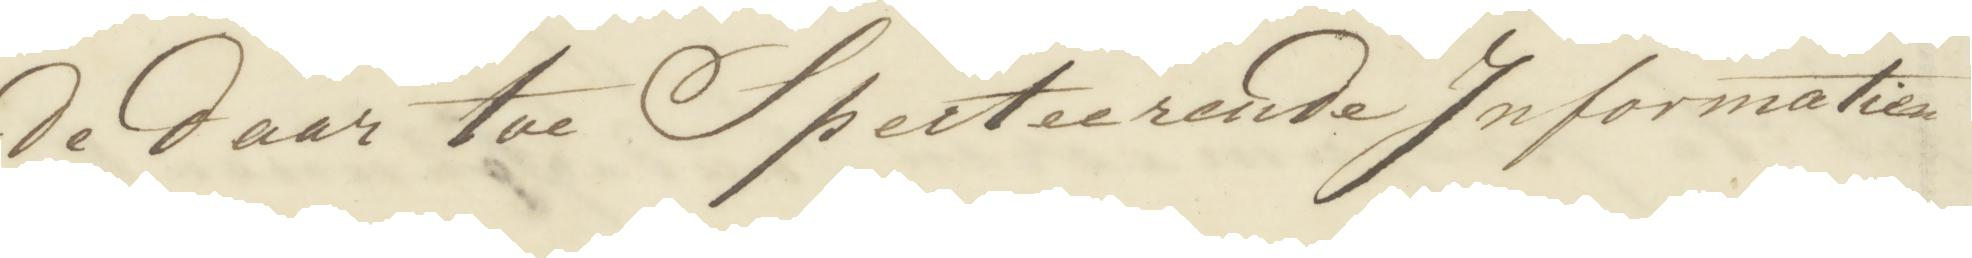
de daar toe Specteerende Jnformatien
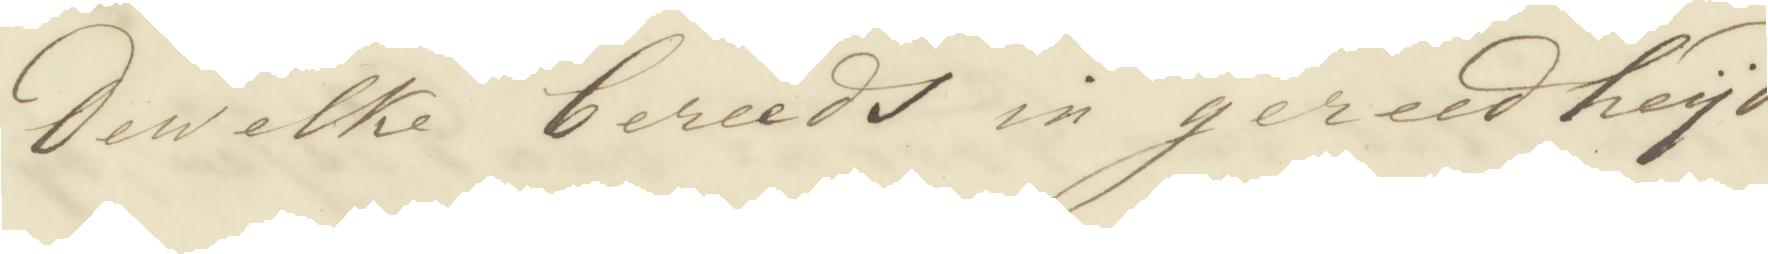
dewelke bereeds in gereedheij
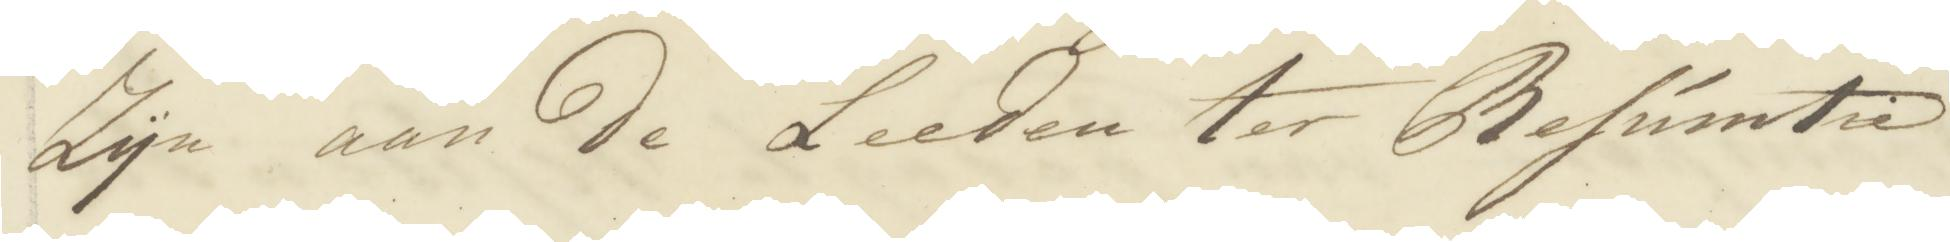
Zijn aan de leeden ter Resumtie
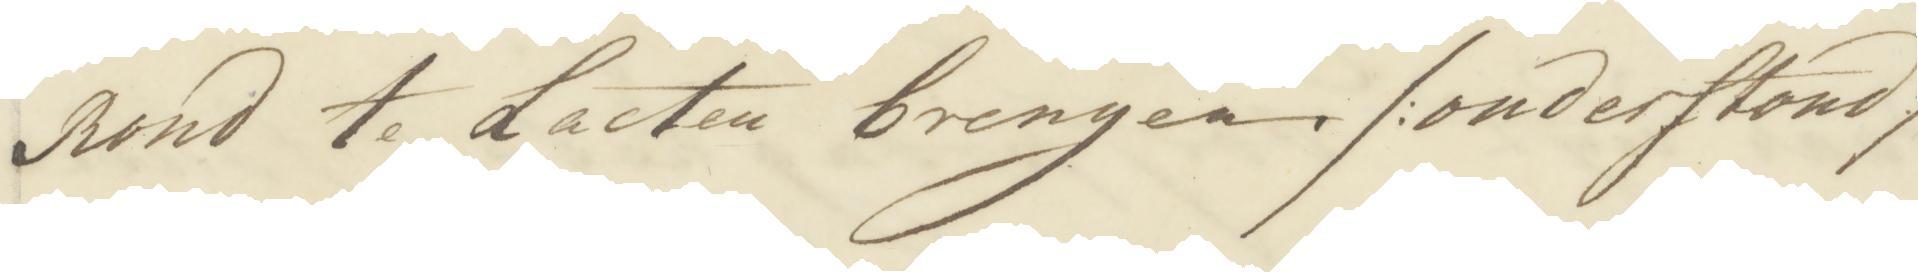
rond te laeten brengen. /:onderstond
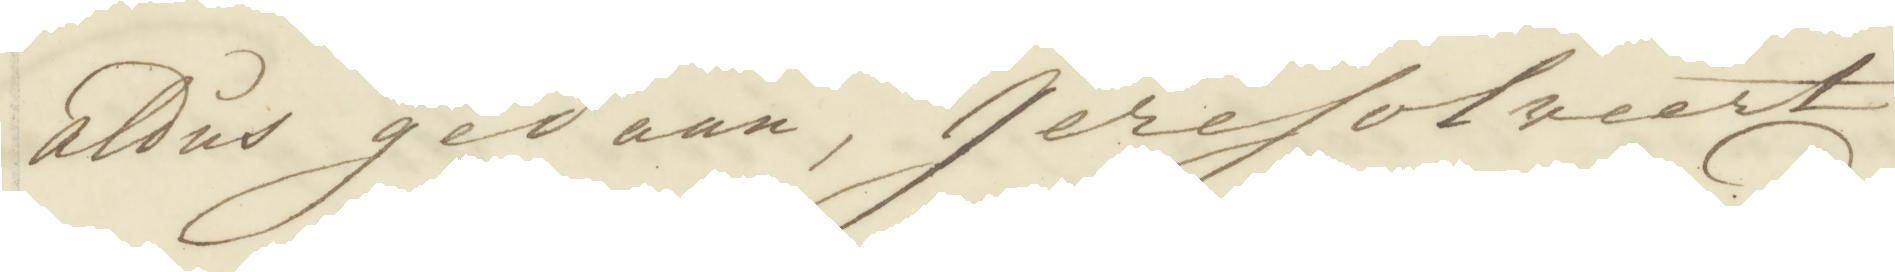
aldus gedaan, geresolveert
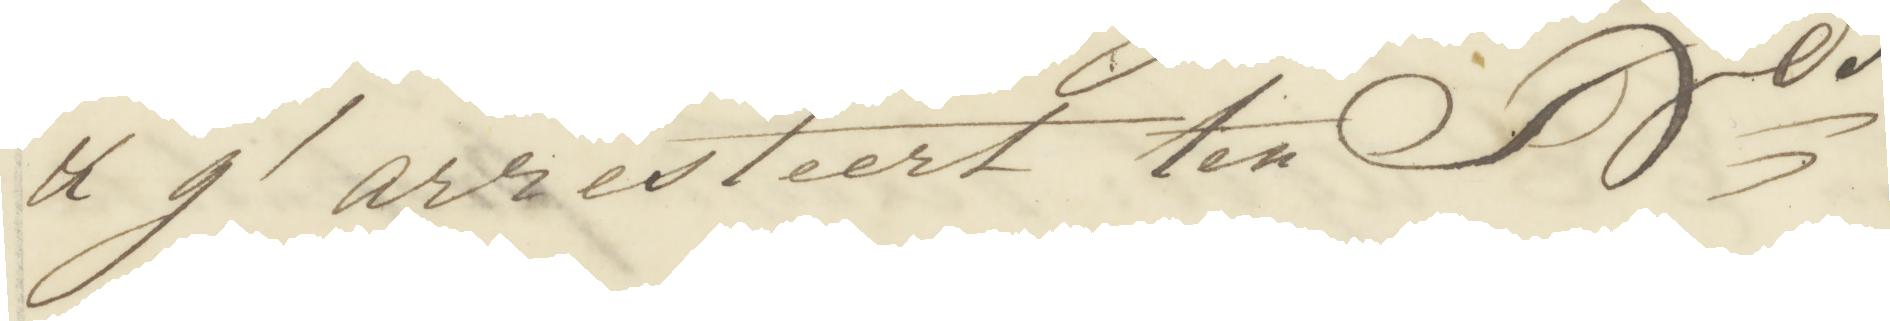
& g’arresteert ten Ed=ls
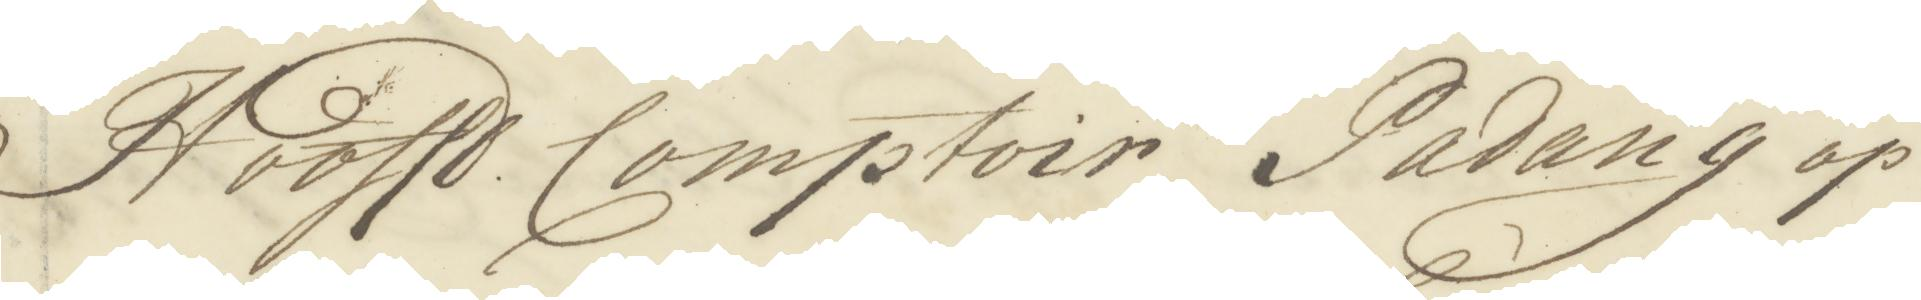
Hooffd Comptoir Padang op
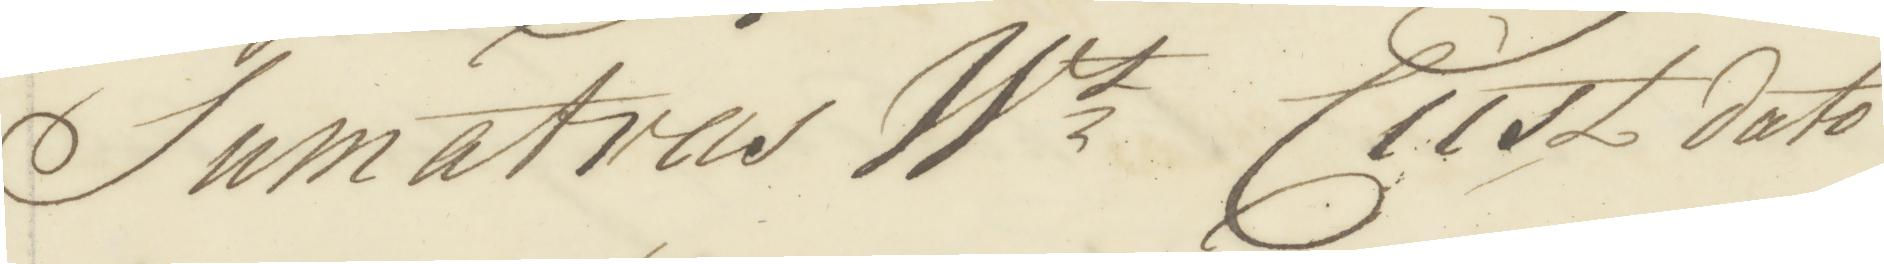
Sumatras W=t Cust dato
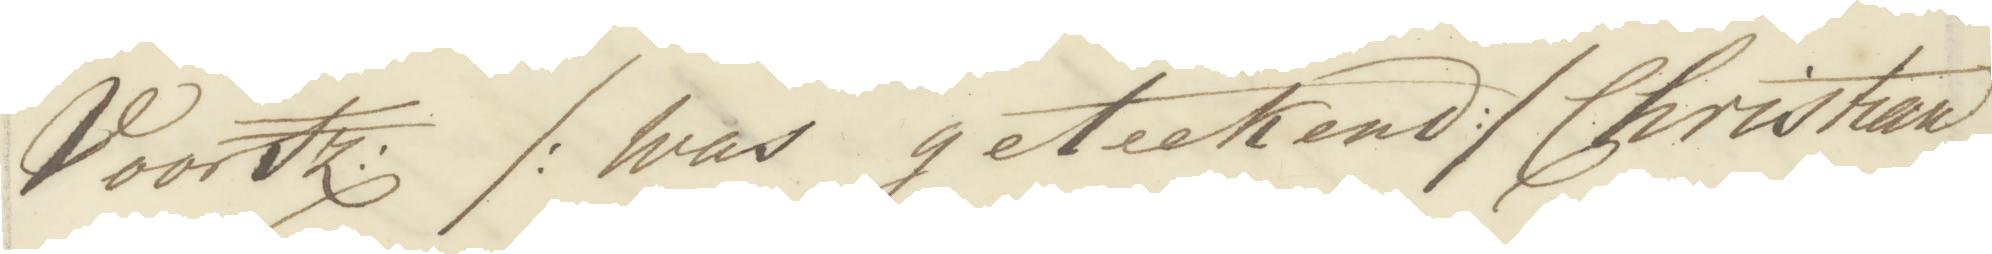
Voorsz: /:was geteekend:/ Christian
